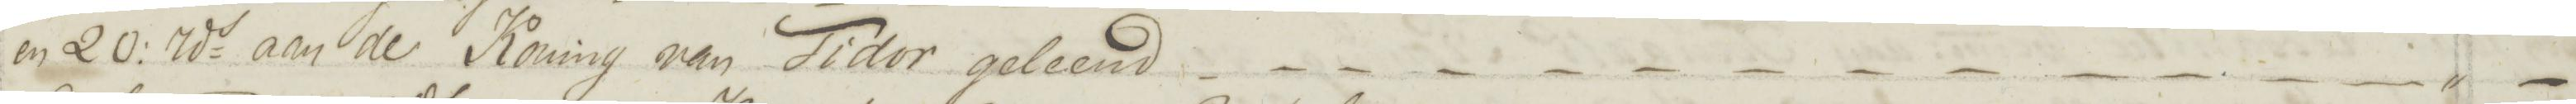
en 20: rd=s aan de Koning van Tidor geleend – – – – – – – – — — — — „ —
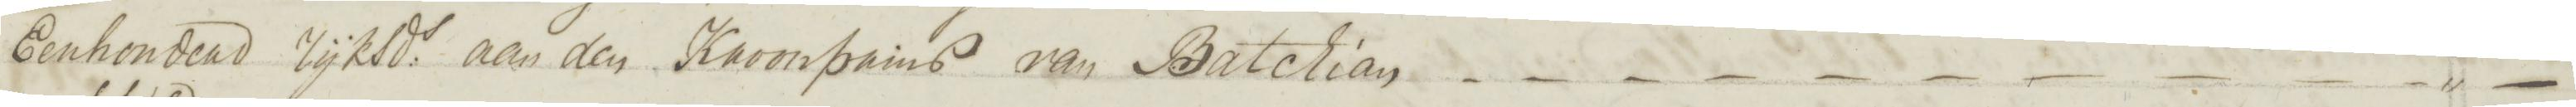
Eenhonderd rijksd:s aan den Kroonprins van Batchian – – – — — — — — — – „ —
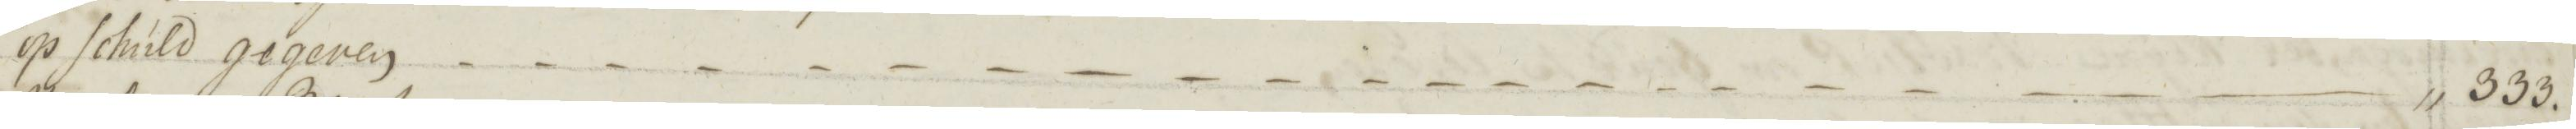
op schuld gegeven – – – – – – – — — — — — — — – – – – — — — „ 333.
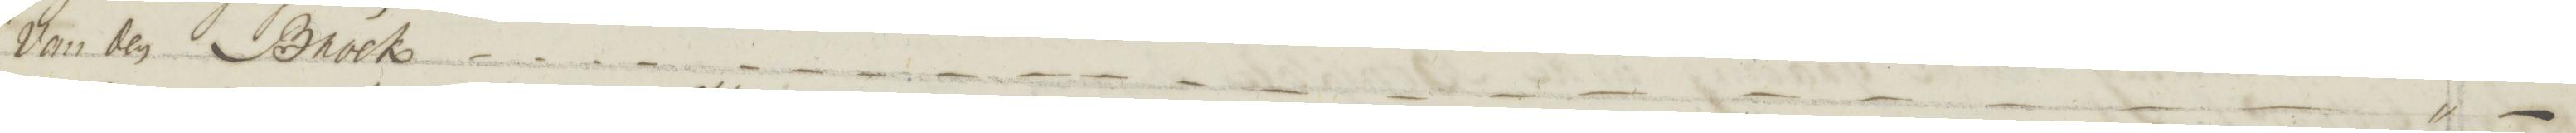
Van den Brook – - - – – – – – — — — — — — — — — — — „ —
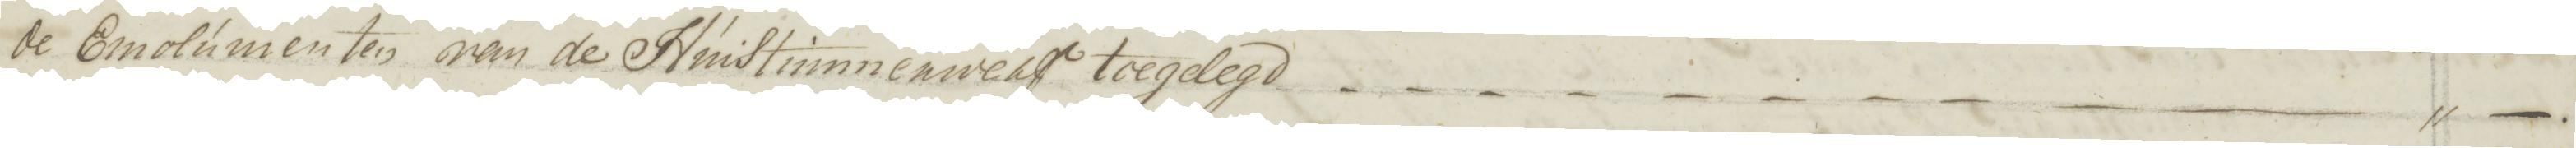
de Emolumenten van de Huistimmerwerf toegelegd - – – – – – – – — — „ — .
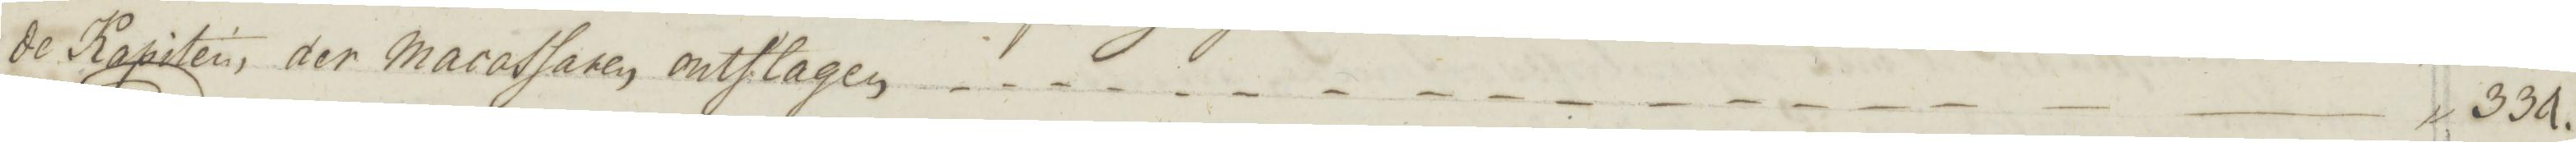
de Kapitein, der macassaren ontslagen – - – – - – – – – – – – – — — — — „ 334
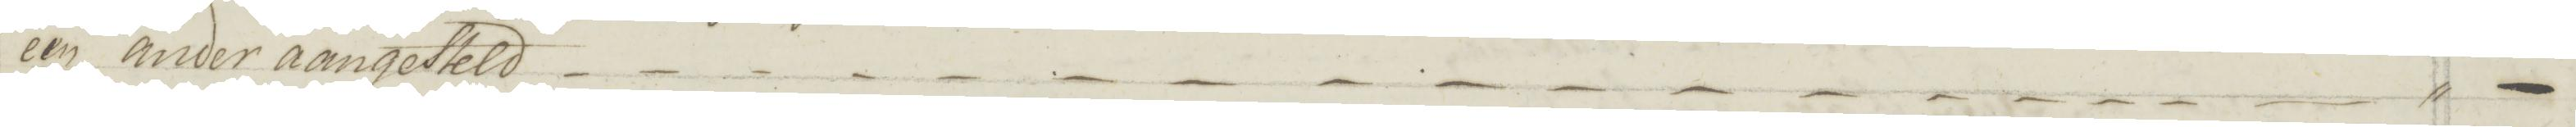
een ander aangesteld – — – – – — — — — — — — — — — — — „ —
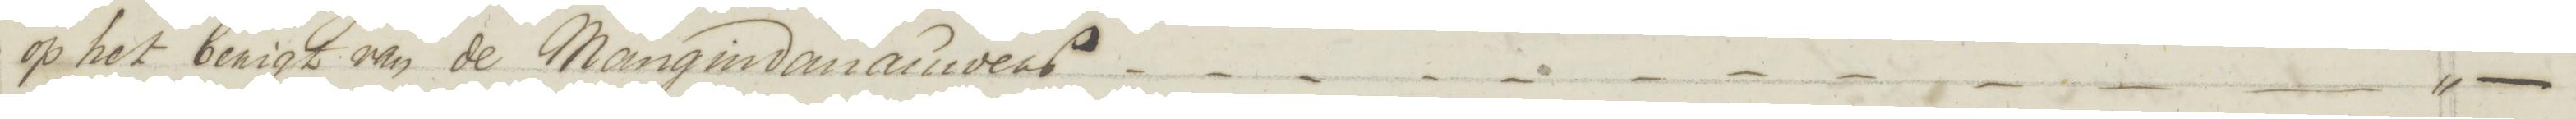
op het berigt van de Mangindanauwers – – – – – – – — — — — — „ —
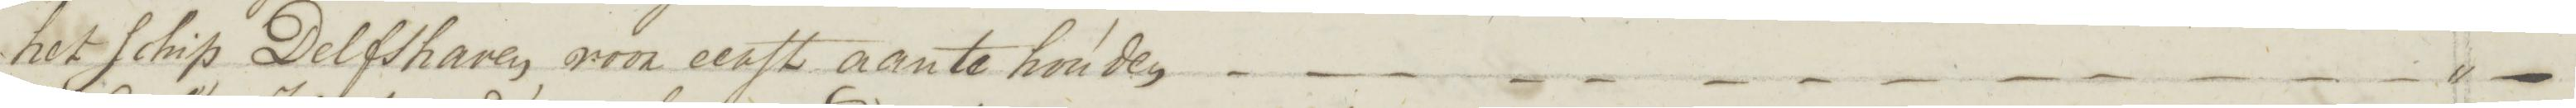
het schip Delfshaven voor eerst aan te houden – – – – – – – — — — — — — „ —
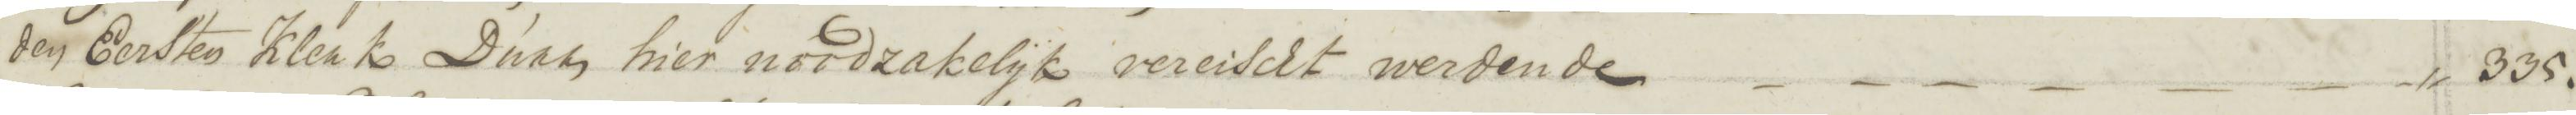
den Eersten klerk Durr hier noodzakelijk vereischt werdende — — — — — — - „ 335
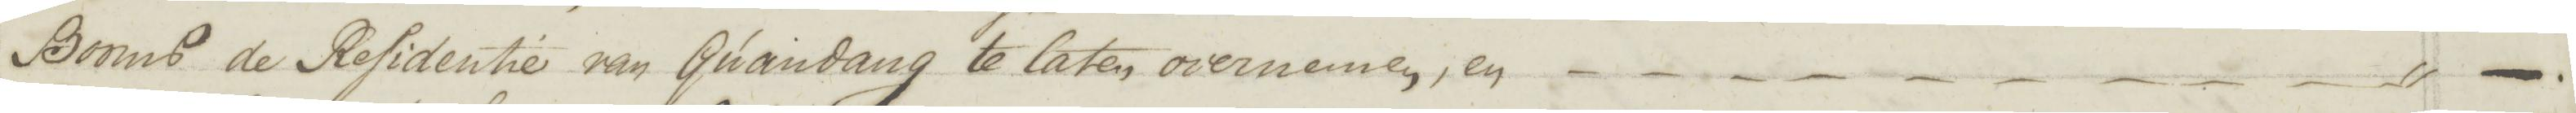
Booms de Residentie van Quandang te laten overnemen, en — — — — — — — — — —„ — .
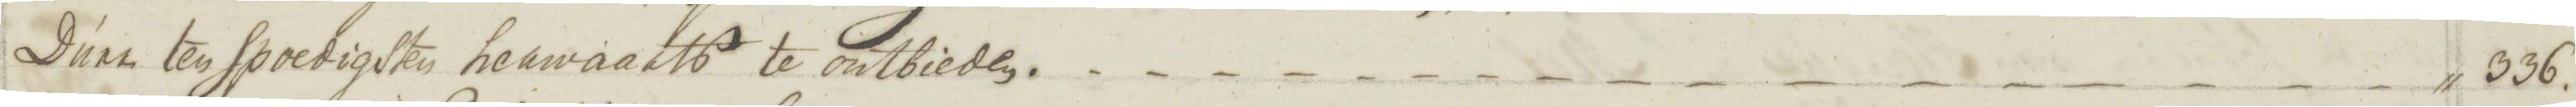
Durr ten spoedigsten herwaarts te ontbieden. - – – – – – – – — — — — — — — – – „ 336.
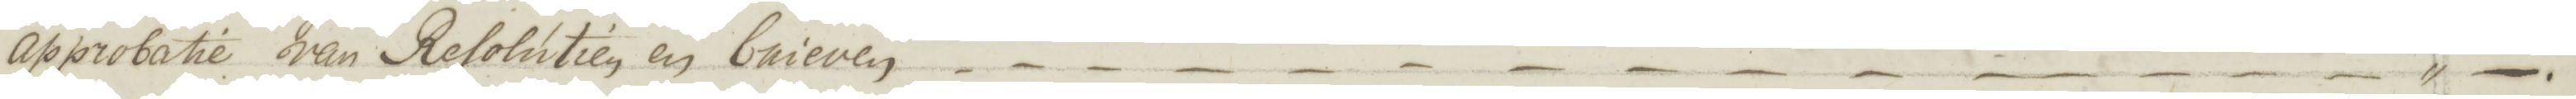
approbatie van Resolutien en brieven – – – — — — — — — — — — — — — „ — .
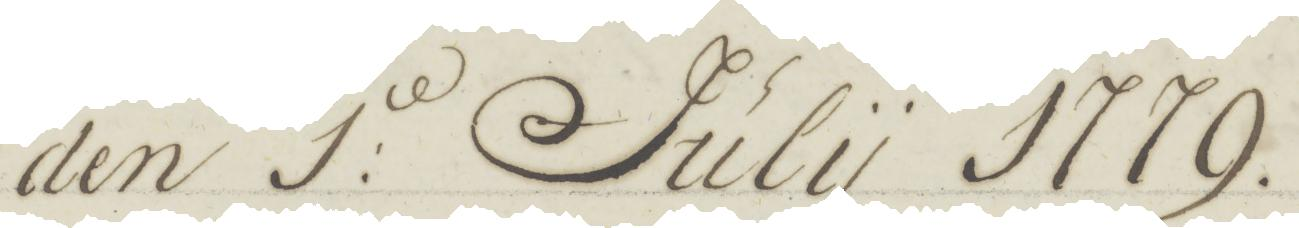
den 1:e Julij 1779.
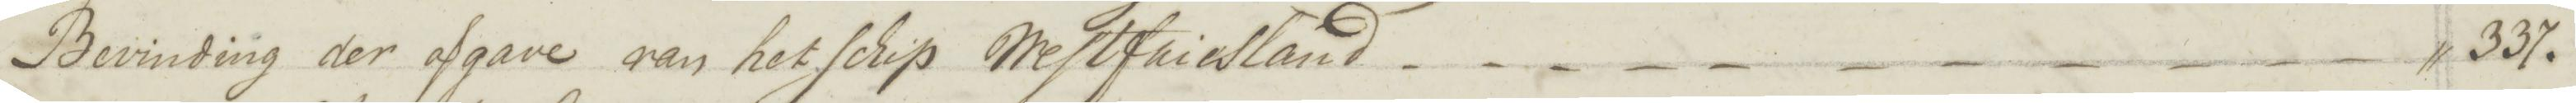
Bevinding der overgave van het schip Westfriesland – – – — — — — — — — — „ 337.
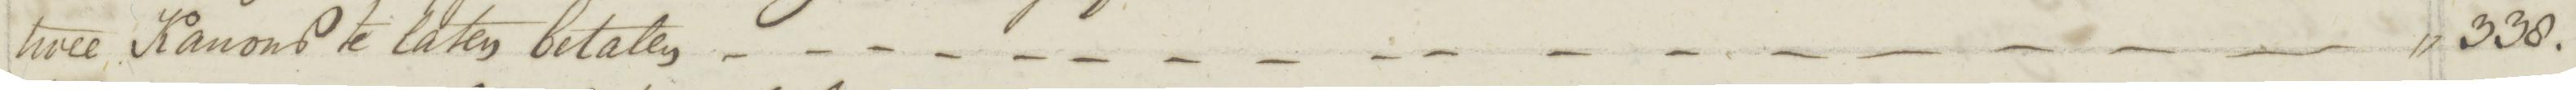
twee Kanons te laten betalen – – – – – – – – – – – – — — — — — „ 338.
